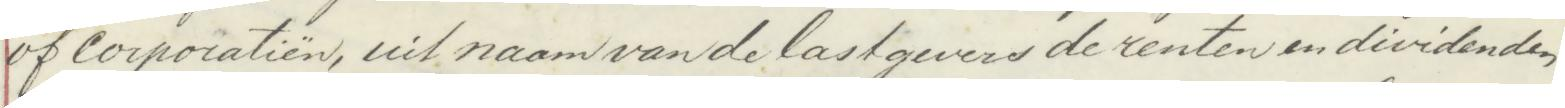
of Corporatiën, uit naam van de lastgevers de renten en dividenden
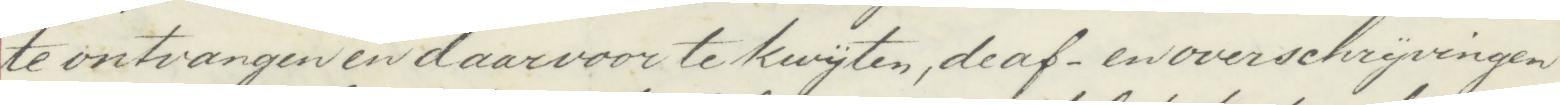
te ontvangen en daarvoor te kwijten, de af- en overschrijvingen
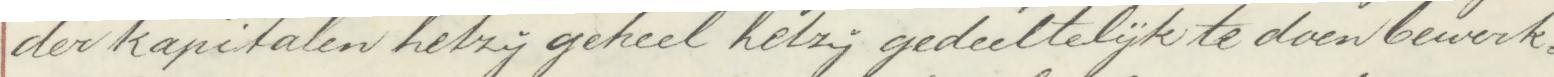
der kapitalen hetzij geheel hetzij gedeeltelijk te doen bewerk=
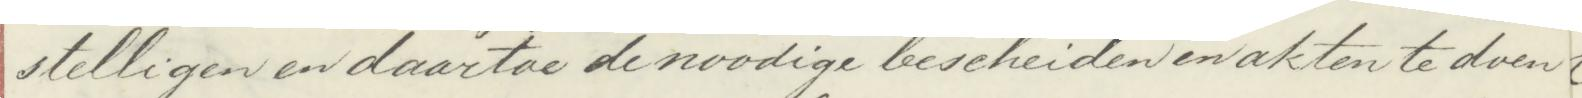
stelligen en daartoe de noodige bescheiden en akten te doen
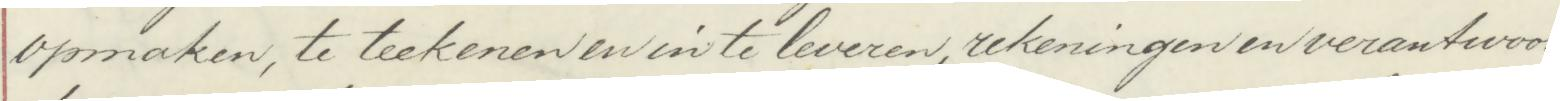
opmaken, te teekenen en in te leveren, rekeningen en verantwoor„
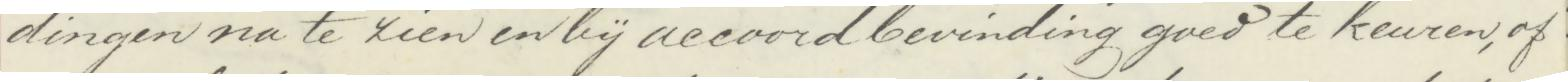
dingen na te zien en bij accoord bevinding goed te keuren, of
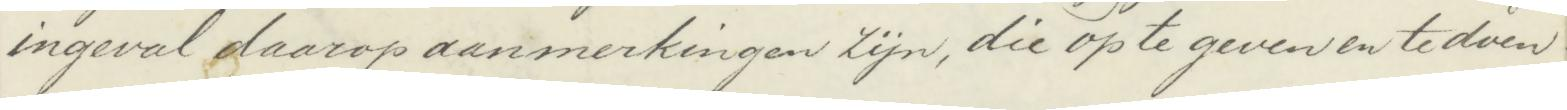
ingeval daarop aanmerkingen zijn, die op te geven en te doen
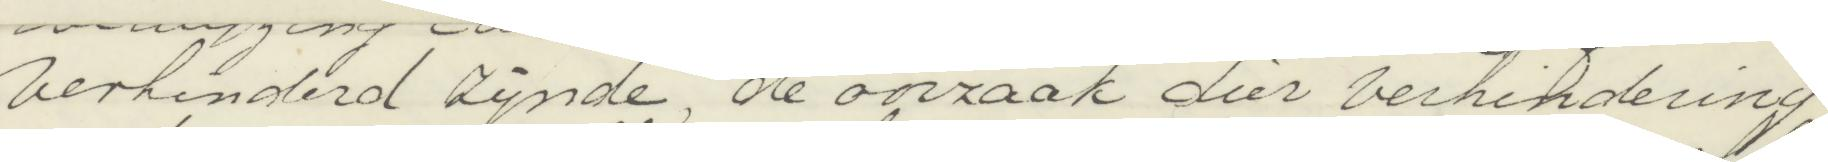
verhinderd zijnde, de oorzaak dier verhindering
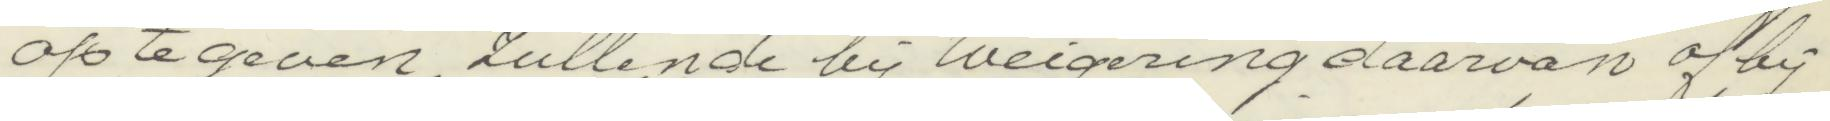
op te geven, zullende bij weigering daarvan of bij
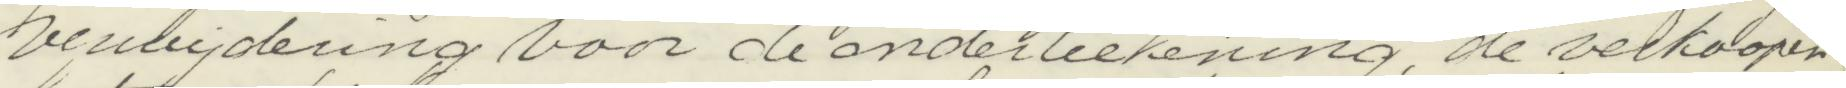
verwijdering voor de onderteekening, de verkooper
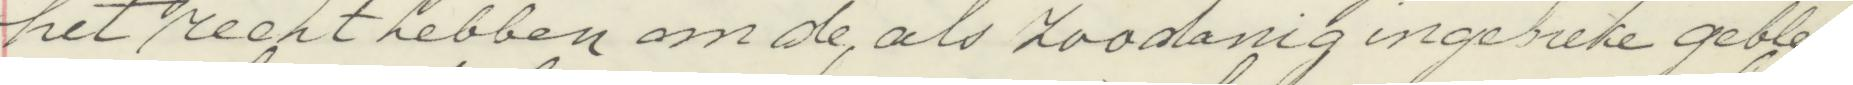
het rechthebben om de, als zoodanig ingebreke geble-
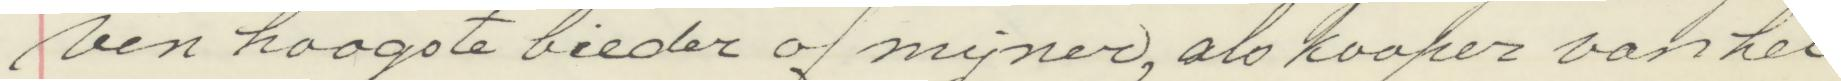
ven hoogste bieder of mijner, als kooper van het
